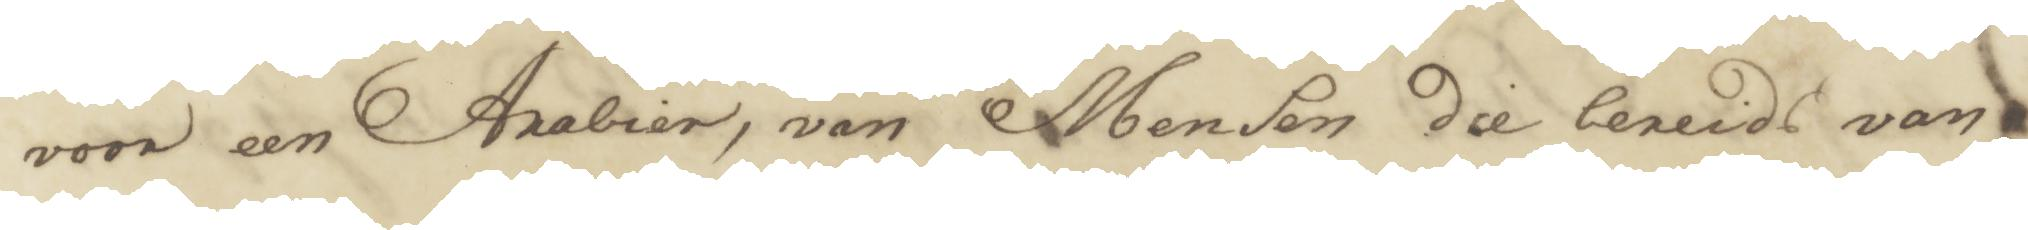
voor een Arabier, van Mensen die bereids van
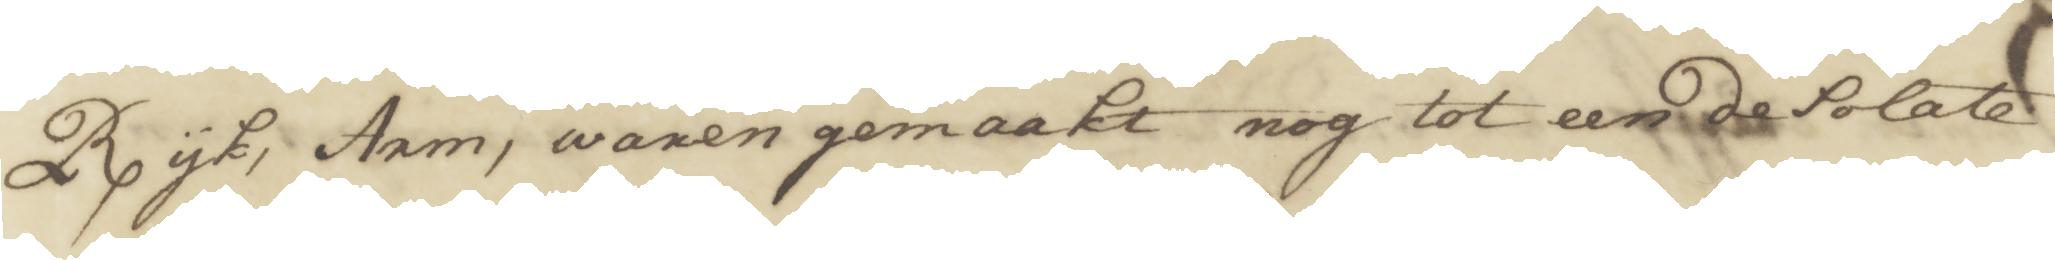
Rijk, Arm, waren gemaakt nog tot een desolate
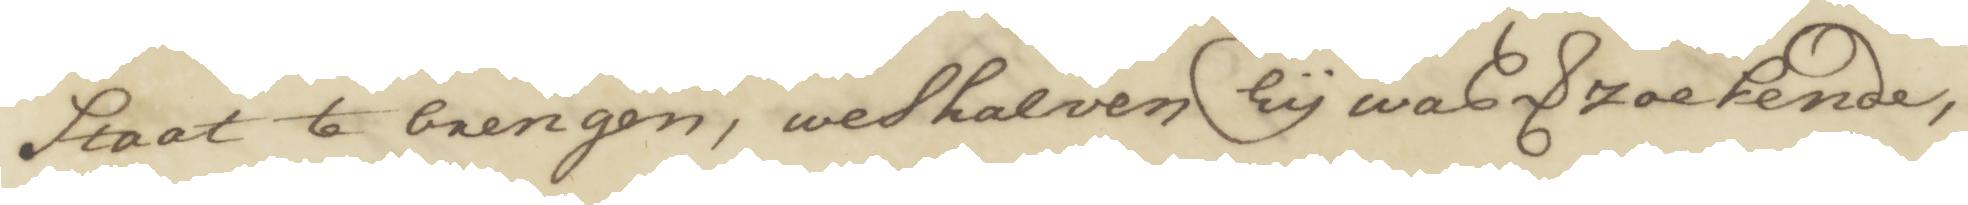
staat te brengen, weshalven hij was verzoekende,
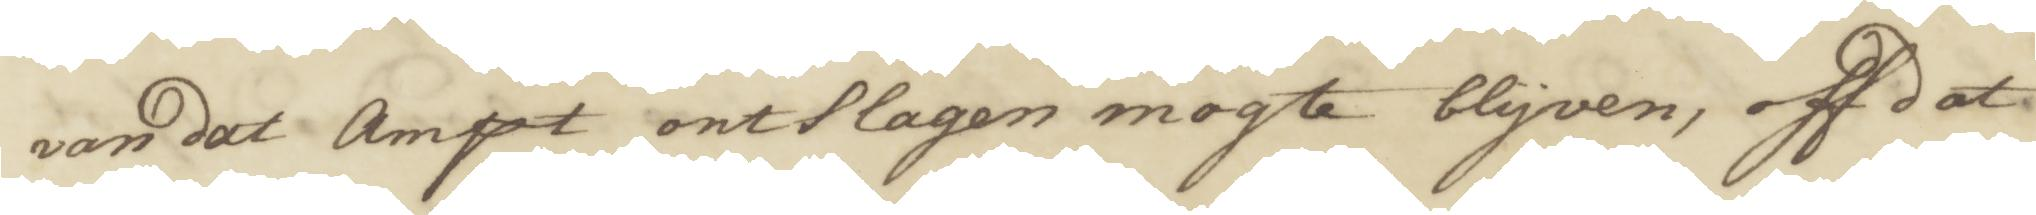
van dat ampt ontslagen mogte blijven, off dat
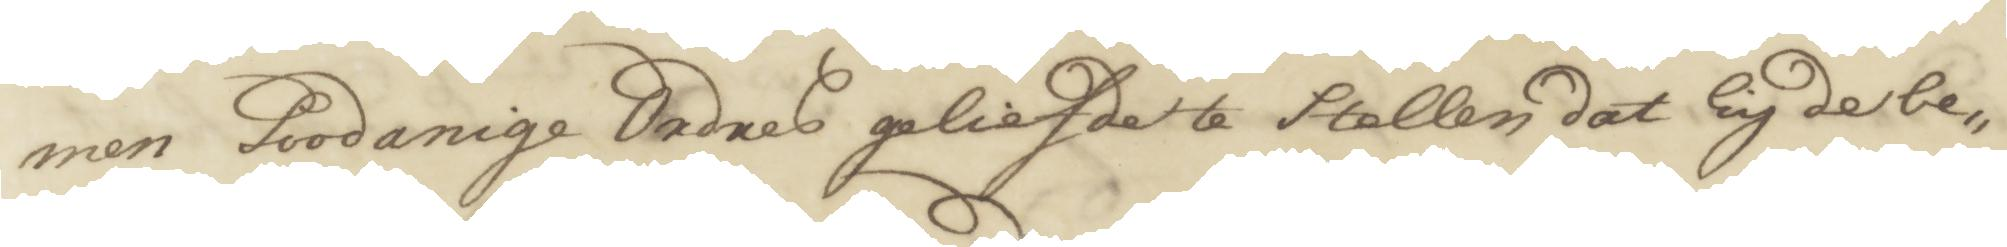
men soodanige Ordres geliefde te stellen dat hij de be„
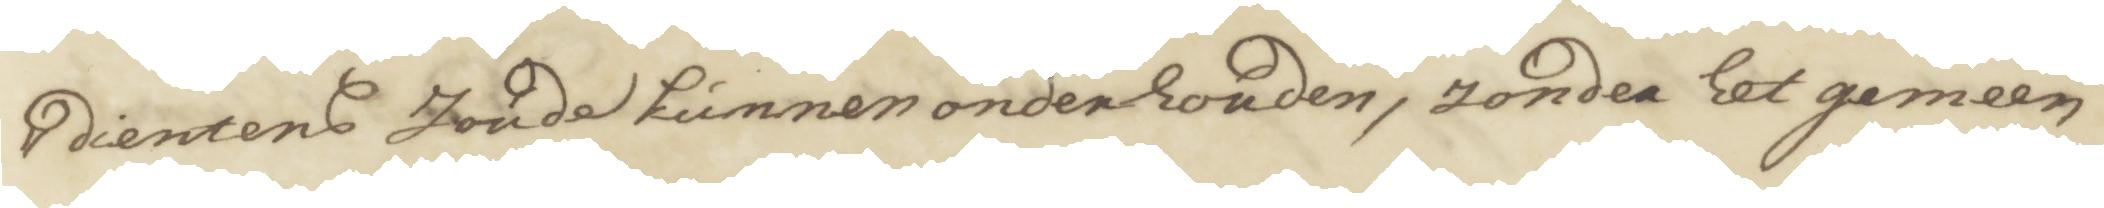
dientens zoude kunnen onderhouden, zonder het gemeen
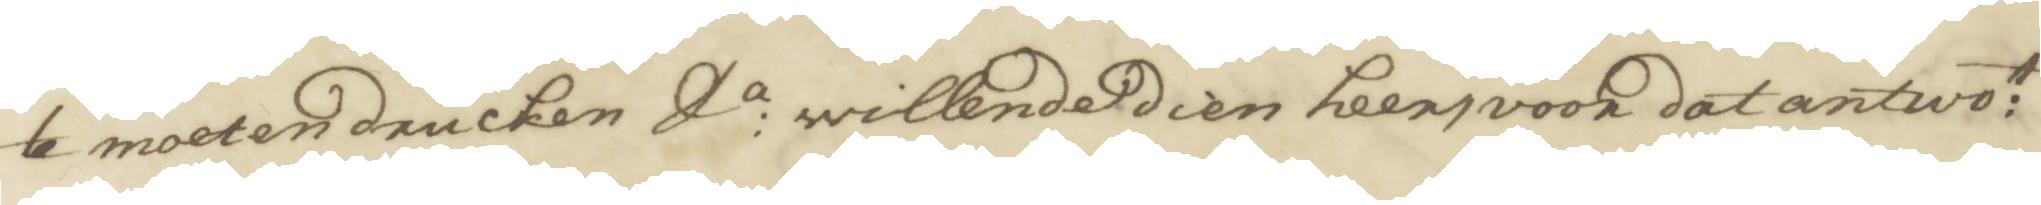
te moeten drucken &:a willende dien heer, voor dat antwo:t
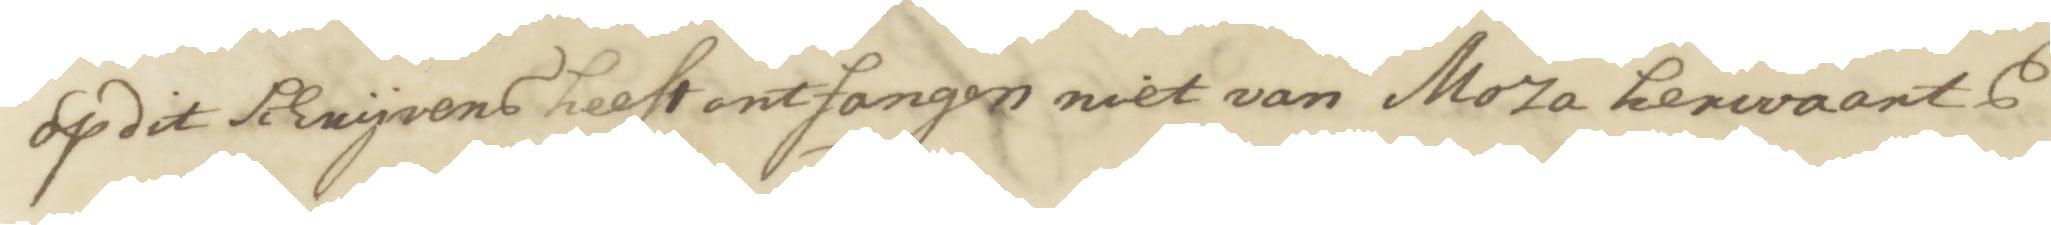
op dit schrijvens heeft ontfangen niet van Moza herwaarts
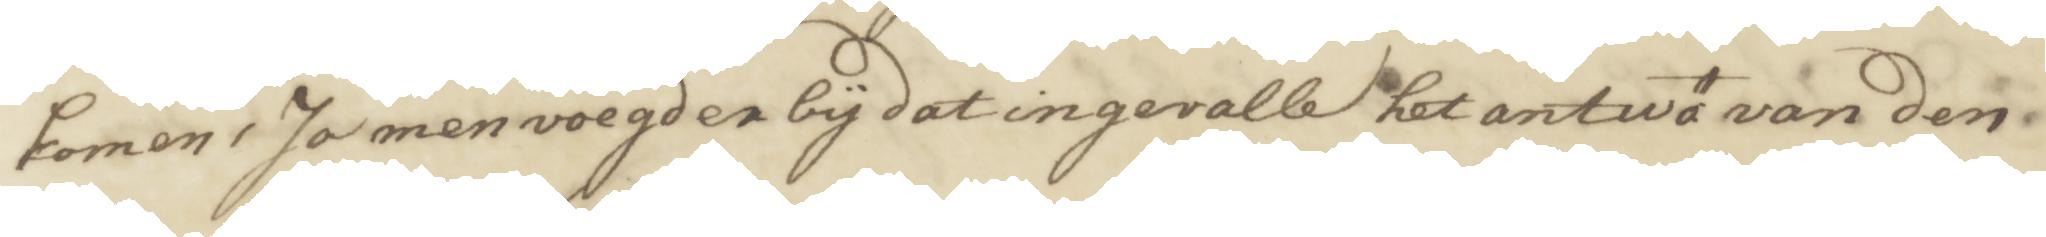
komen, Ja men voegd er bij dat ingevalle het antwo:t van den
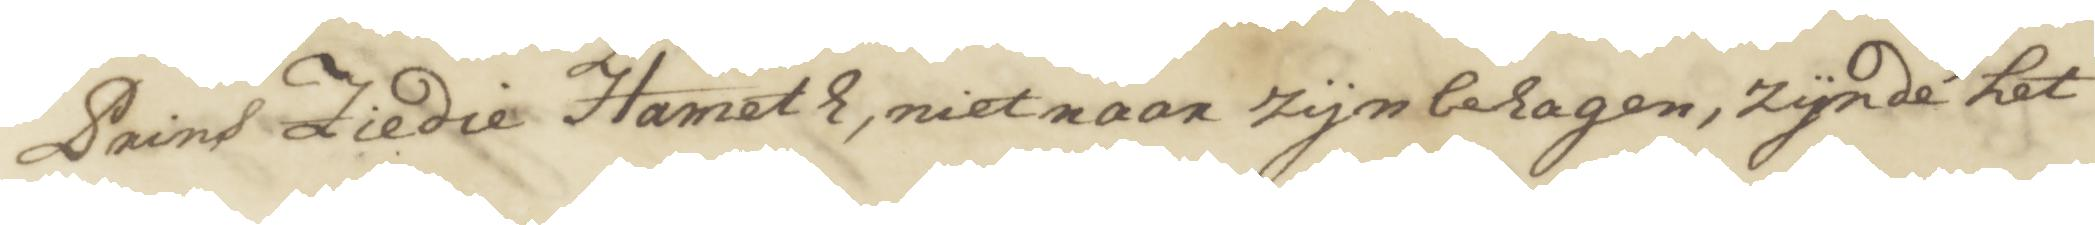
Prins Ziedie Hameth, niet naar zijn behagen, zijnde het
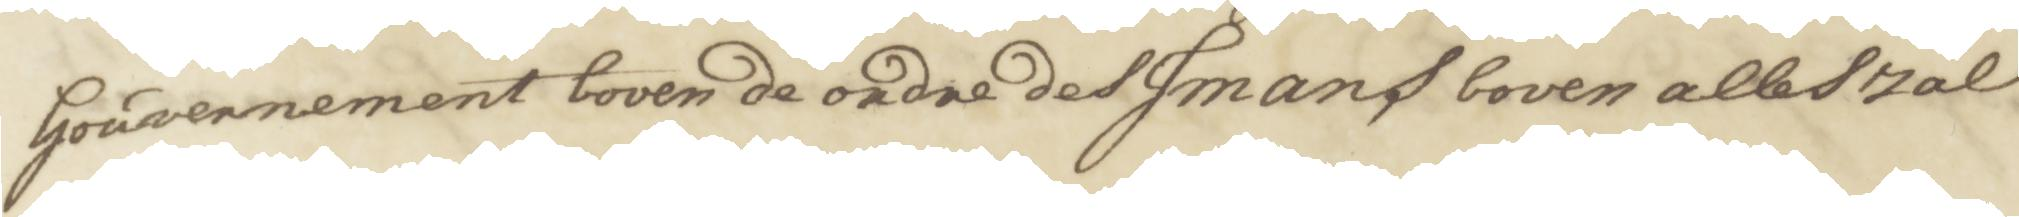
Gouvernement boven de ordre des Jmans boven alles zal
